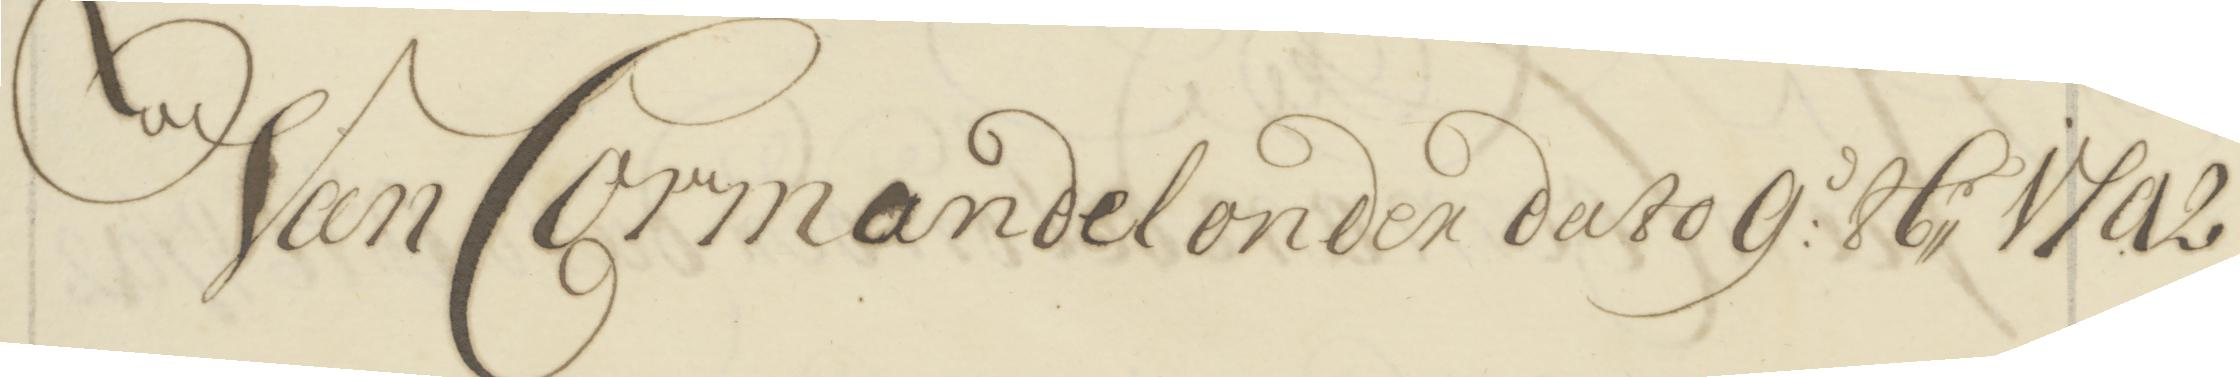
Van Cormandel onder dato 9:' 8b„r 1742
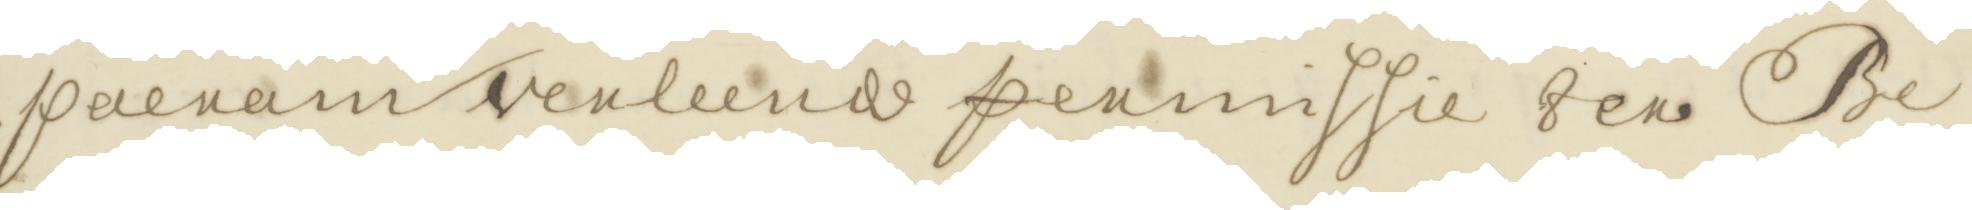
paeram verleende permissie ter Be
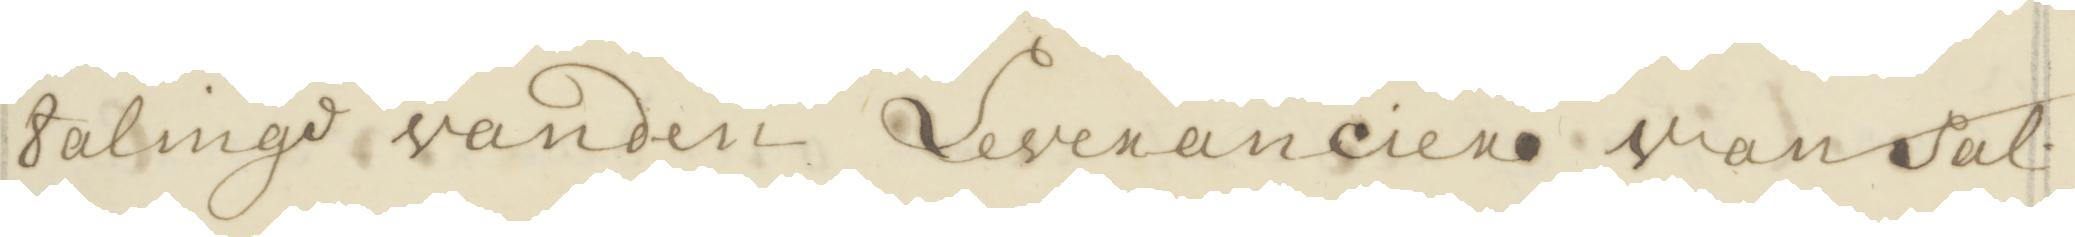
talinge vanden Leverancier van sal
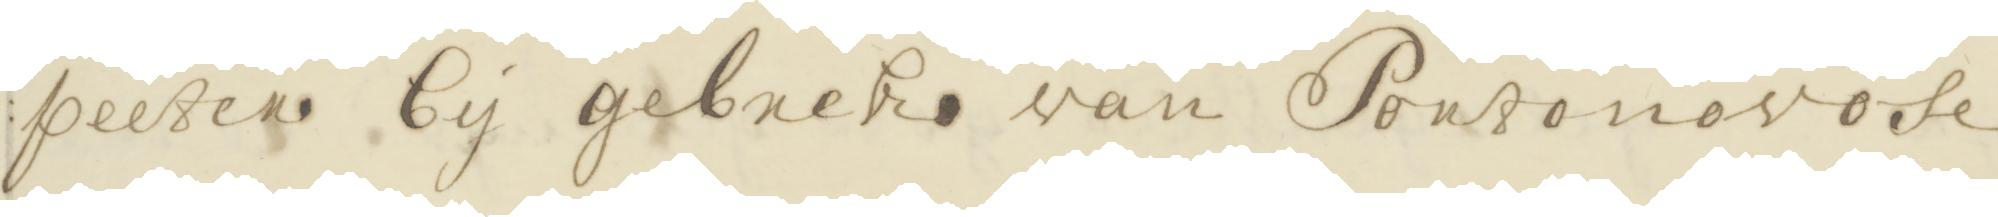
:peeter bij gebrek van Portonovose
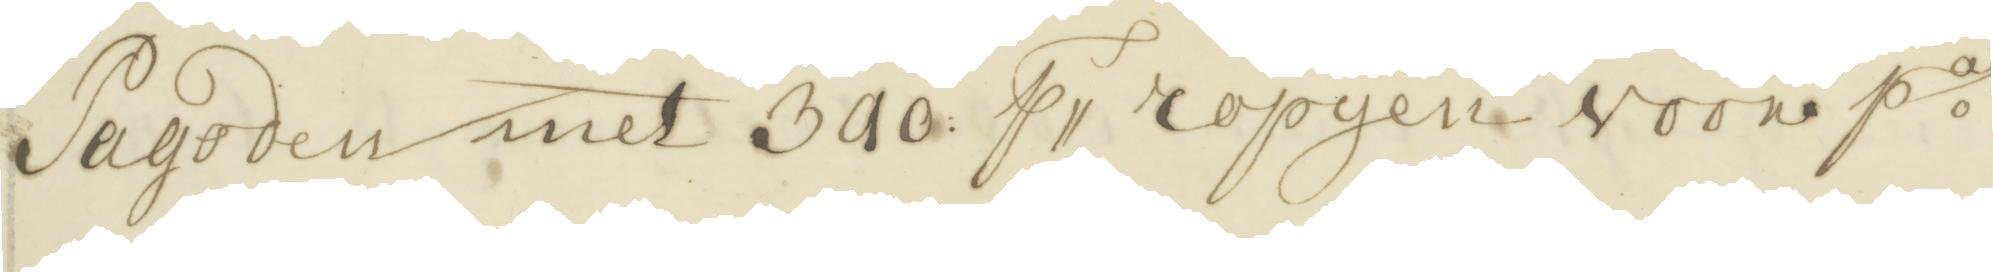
Pagoden met 340: p„s ropijen voor pa/o
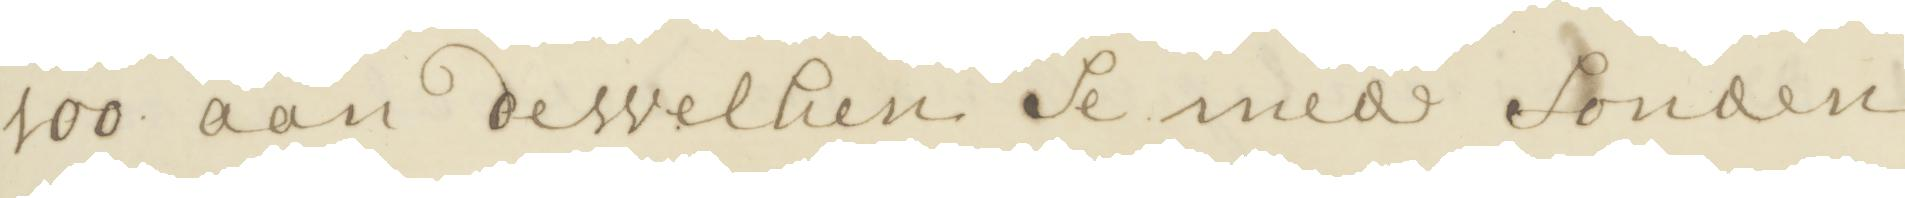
100 aan dewelken se mede souden
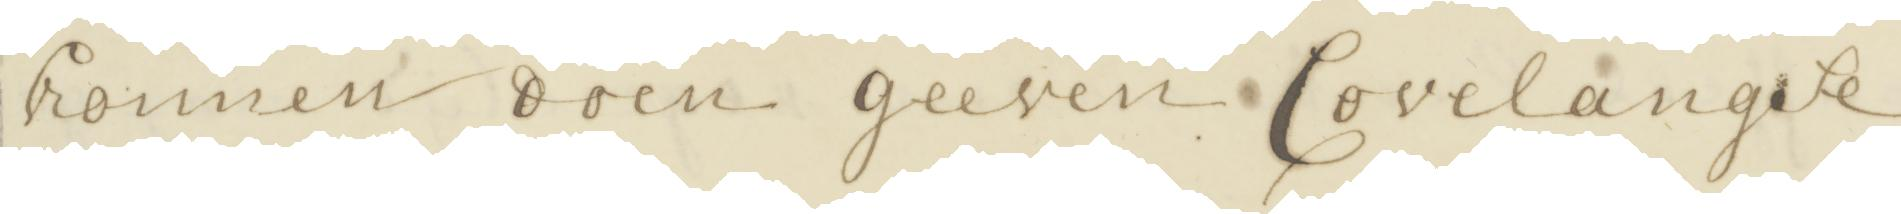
konnen doen geeven Covelangse
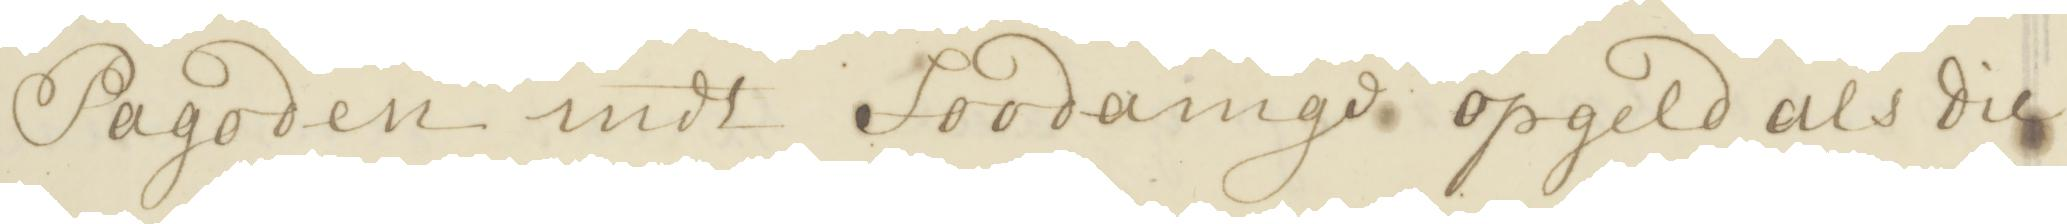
Pagoden met soodanige opgeld als die
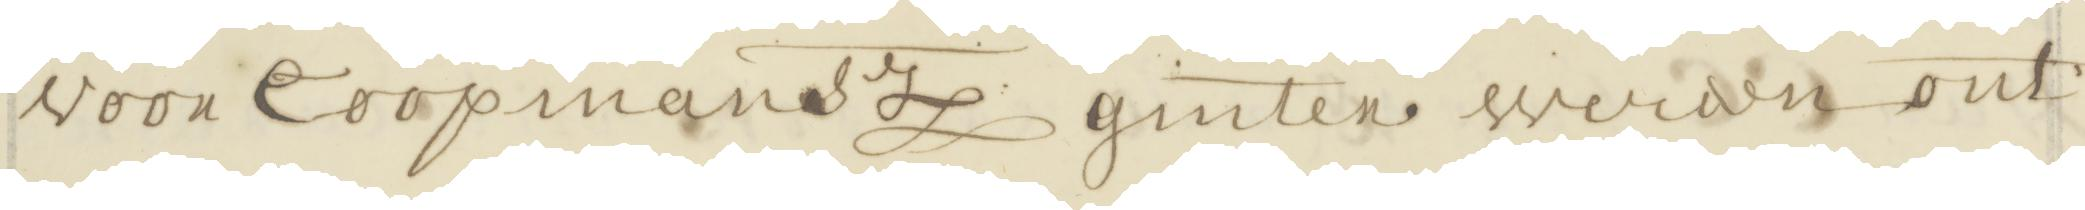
voor Coopmansz ginter werden ont
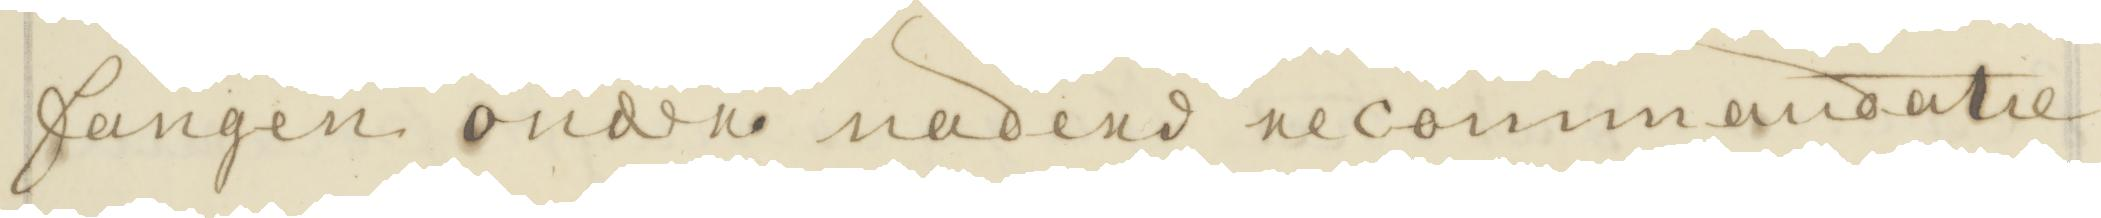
fangen onder nadere recommandatie
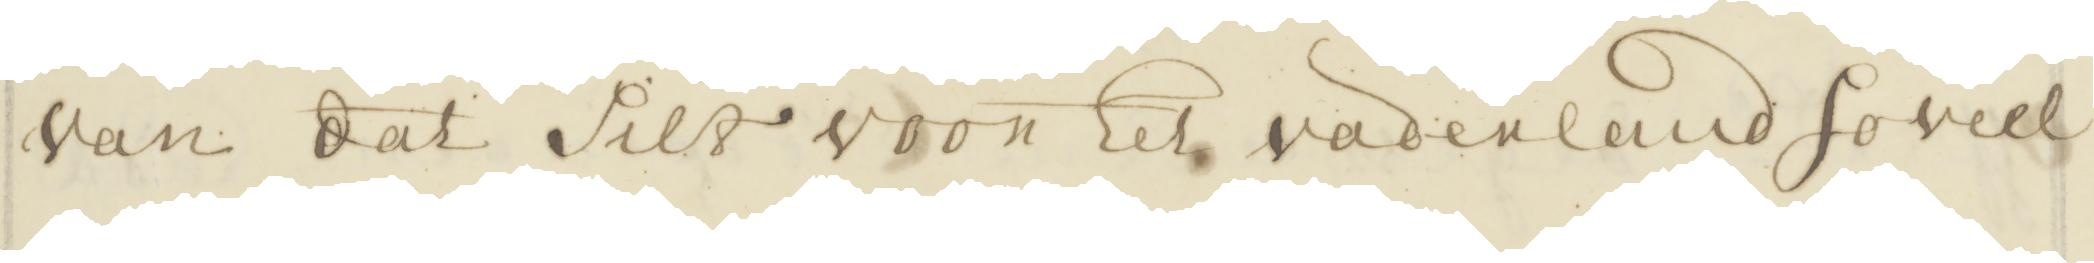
van dat silt voor het vaderland so veel
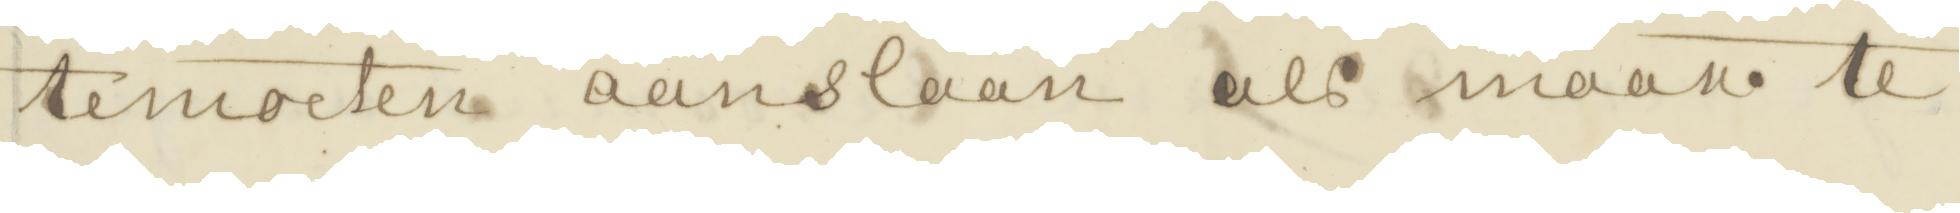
temoeten aanslaan als maar te
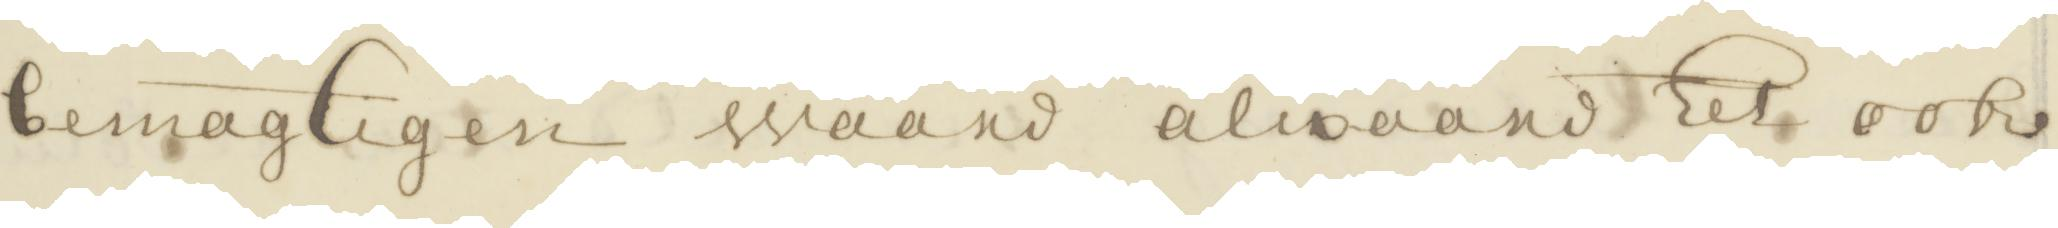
bemagtigen waare alwaare het ook
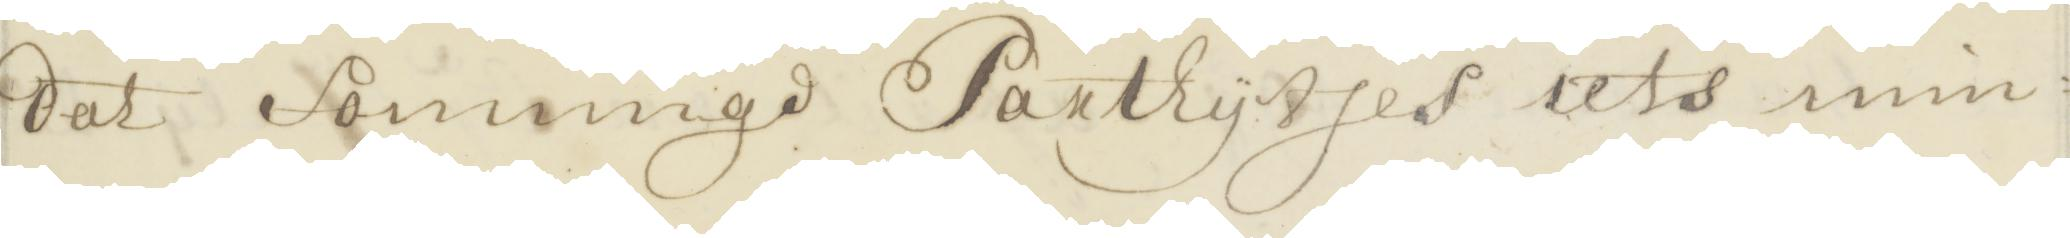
dat sonninge Parthijtjes iets min:
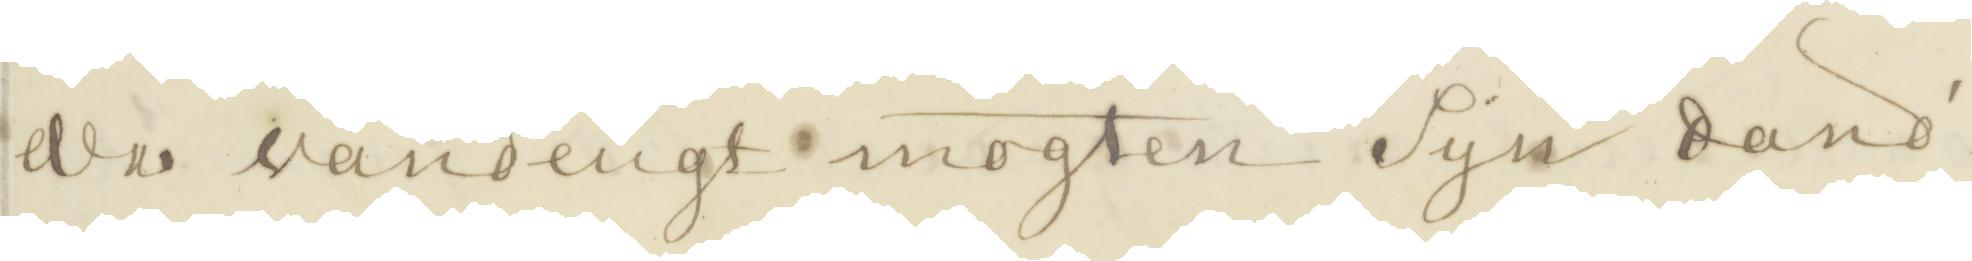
der van deugt mogten sijn dan d'
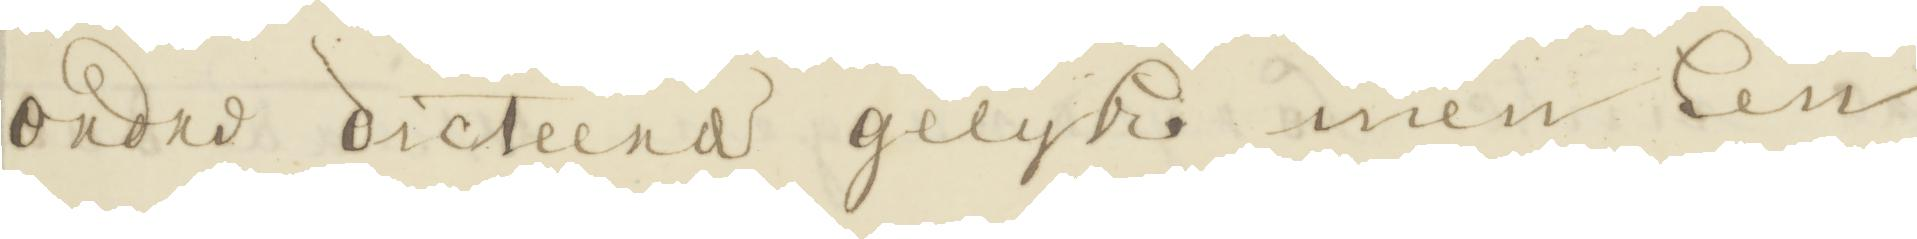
ordre dicteerde gelijk men Een
